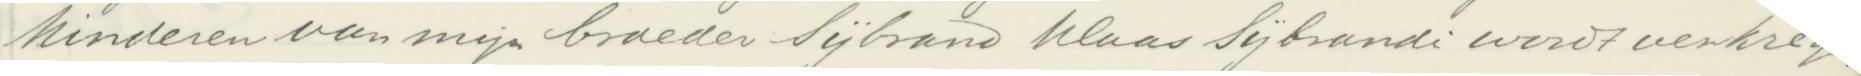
kinderen van mijn broeder Sijbrand Klaas Sijbrandi wordt verkregen
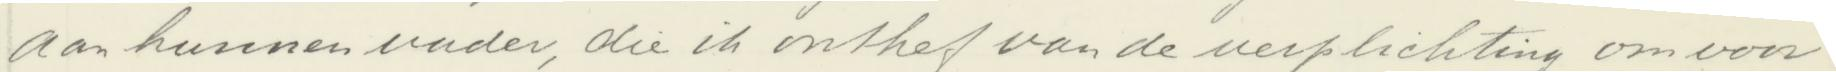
aan hunnen vader, die ik onthef van de verplichting om voor
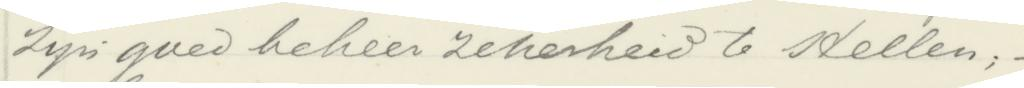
zyn goed beheer zekerheid te stellen;
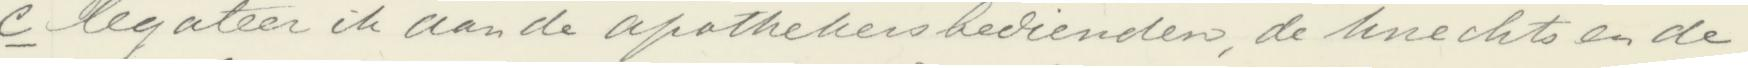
c legateer ik aan de apothekers bedienden, de knechts en de
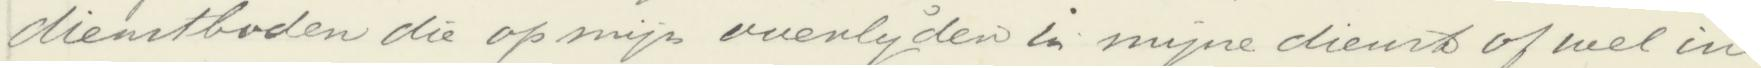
dienstboden die op mijn overlijden in mijne dienst of wel in
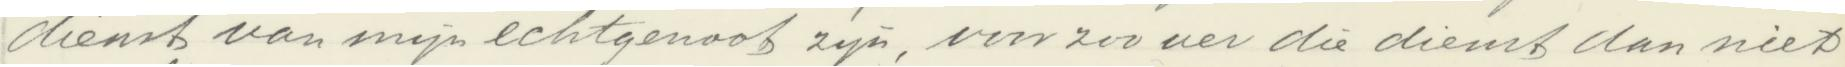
dienst van mijn echtgenoot zijn, voor zoo ver die dienst dan niet
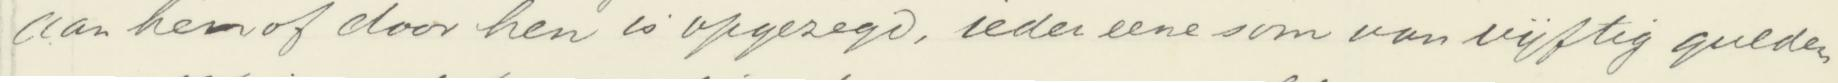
aan hem of door hen is opgezegd, ieder eene som van vijftig gulden
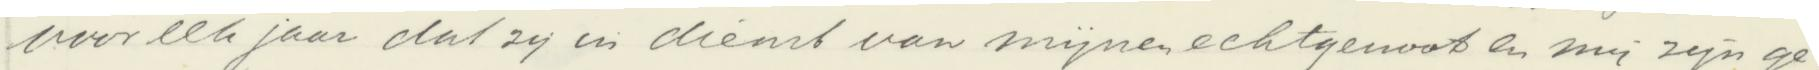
voor elk jaar dat zij in dienst van mijnen echtgenoot en mij zijn ge
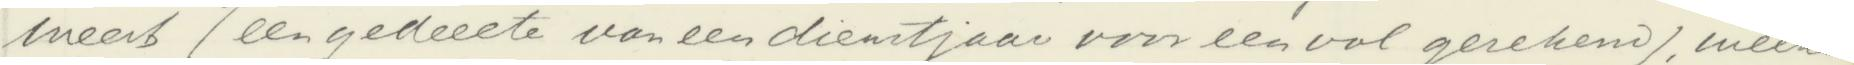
weest / een gedeelte van een dienstjaar voor een vol gerekend /, welke
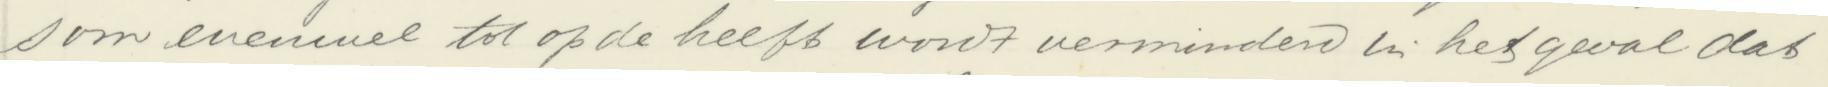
som evenwel tot op de helft wordt verminderd in het geval dat
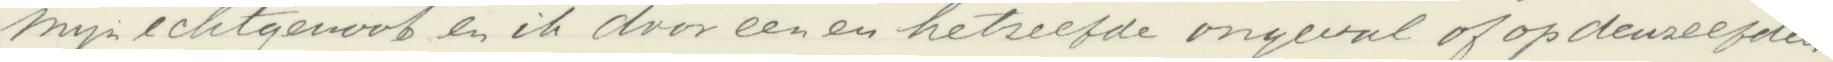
myn echtgenoot en ik door een en hetzelfde ongeval of op denzelfden
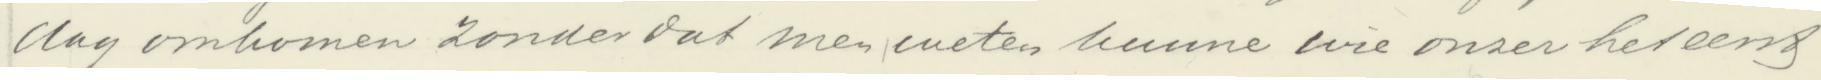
dag omkomen zonder dat men weten kunne wie onzer het eerst
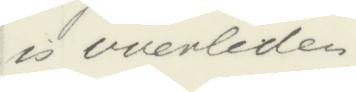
is overleden
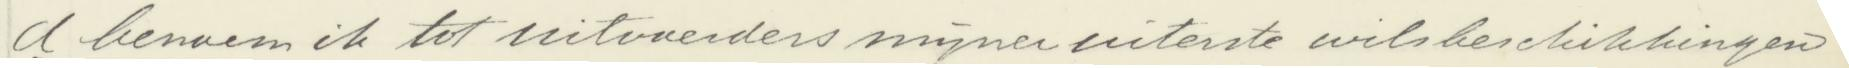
d benoem ik tot uitvoerders mijner uiterste wilsbeschikkingen
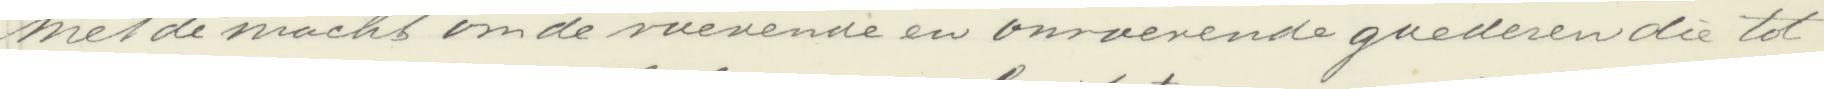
met de macht om de roerende en onroerende goederen die tot
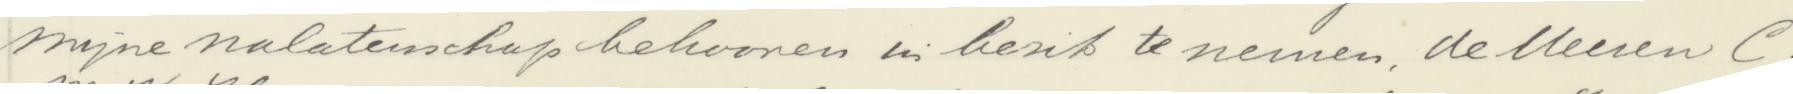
mijne nalatenschap behooren in bezit te nemen, de Heeren C
